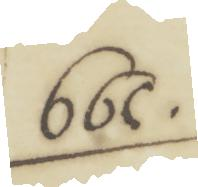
665.
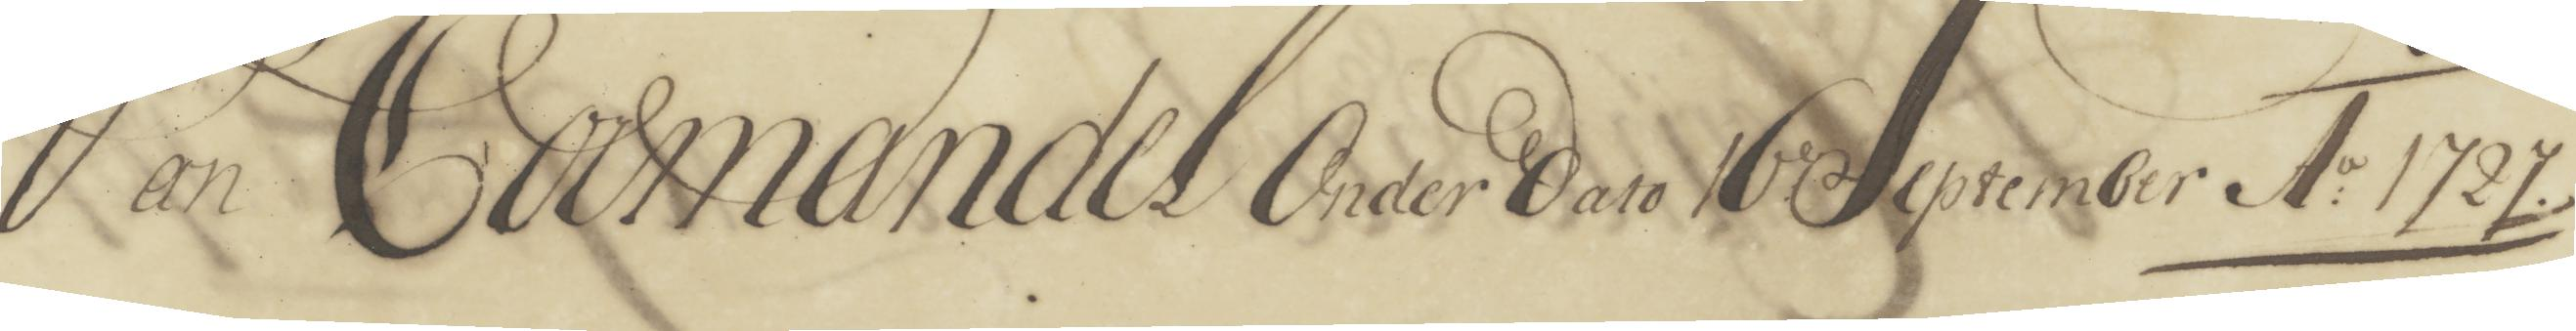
Van Cormandel Onder dato 16:' September A:o 1727.
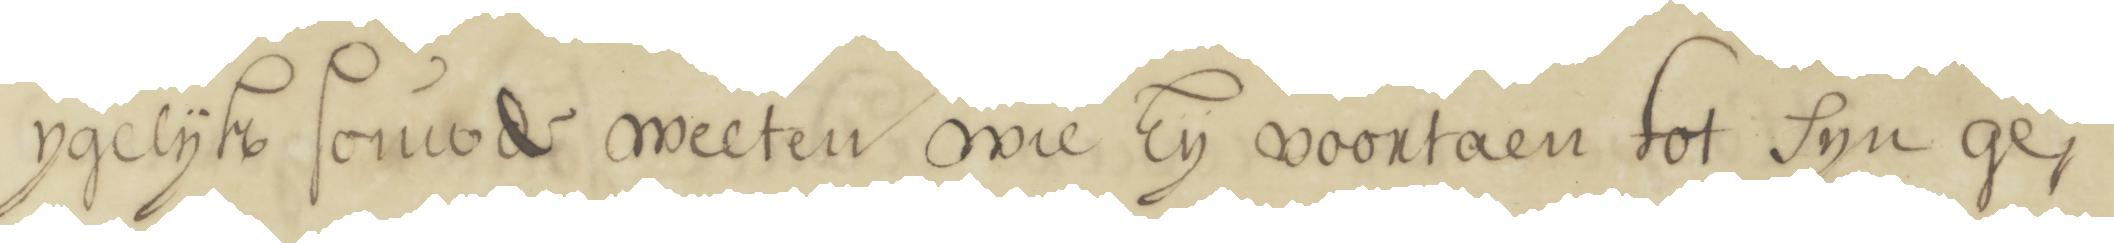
ygelijk souwde weeten wie hij voortaen tot syn ge
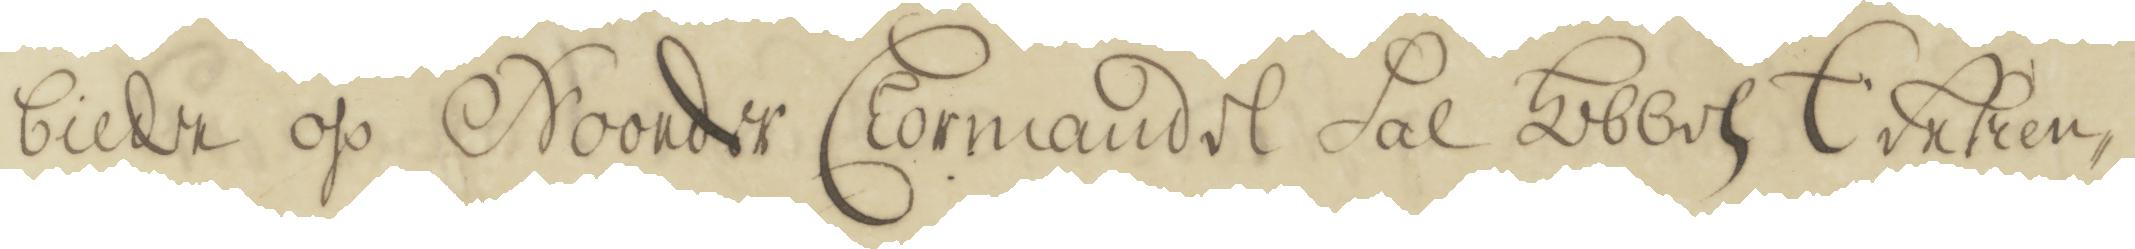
bieder op Noorder Chormandel Sal hebben T Erken„
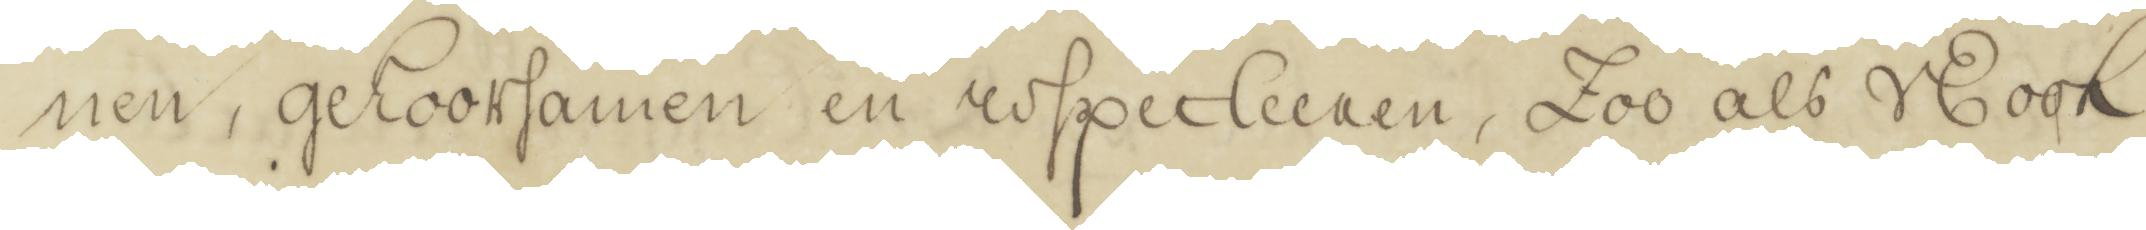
nen, gehoorsamen en respecteeren, Zoo als VE ook
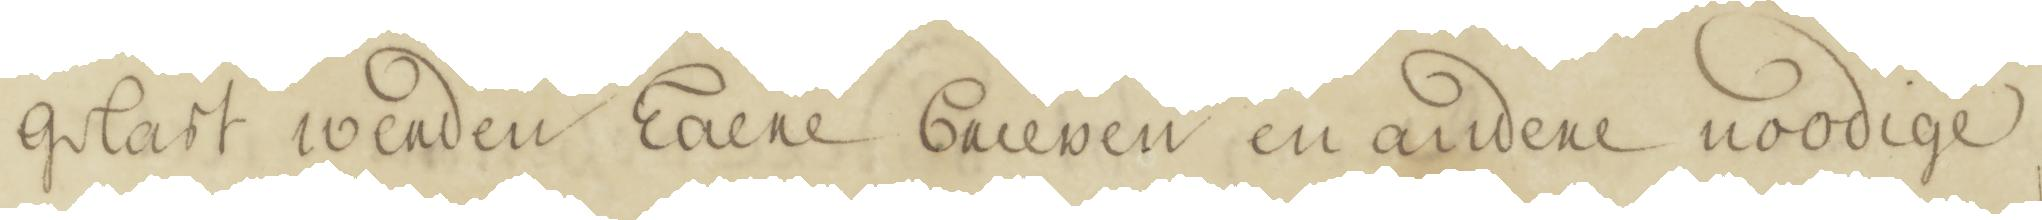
gelast werden haere brieven en andere noodige
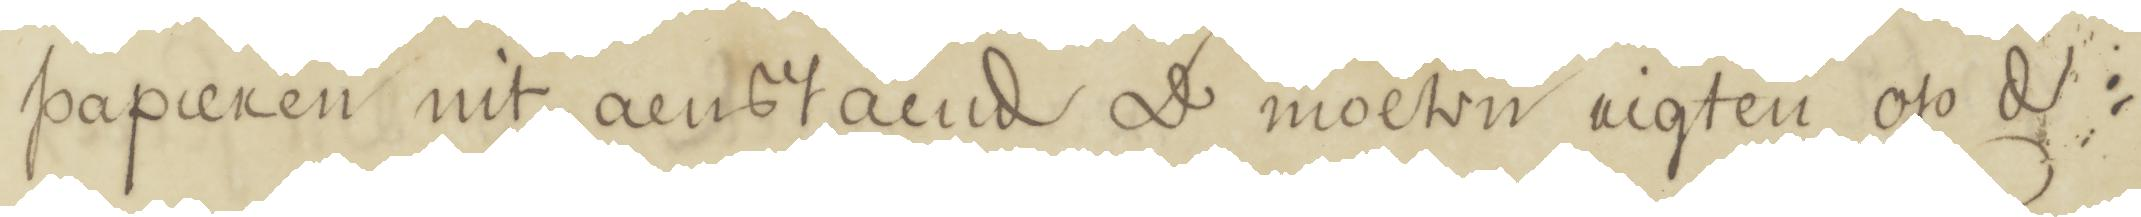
papieren int aenstaende te moeten rigten op de
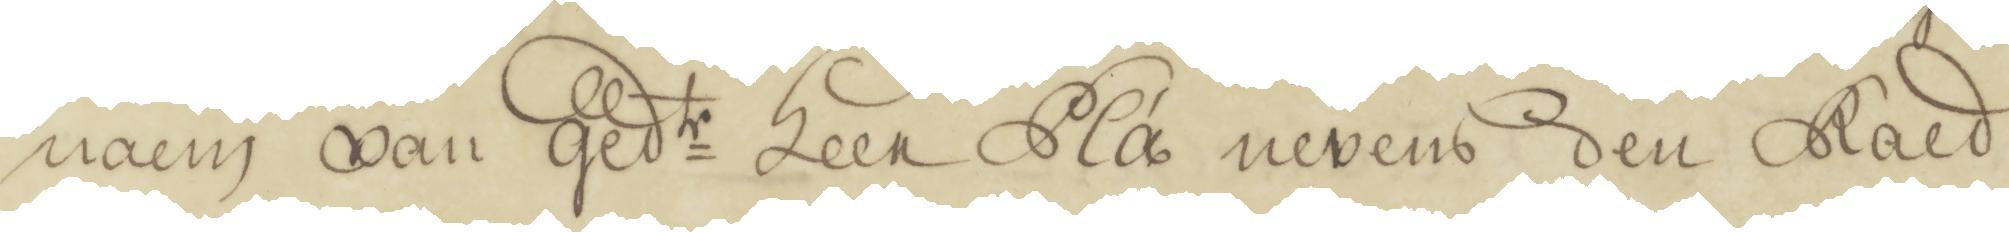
naem van ged=te heer Pla nevens den Raed
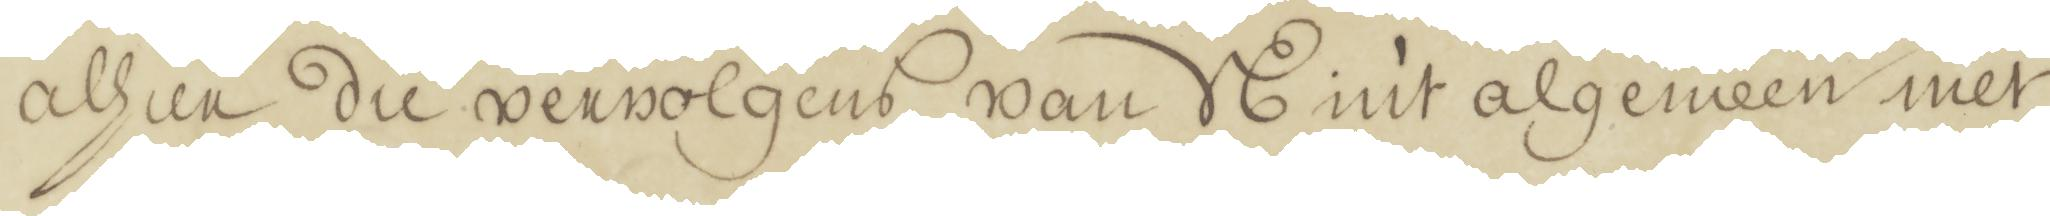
alhier die vervolgens van VE in't algemeen niet
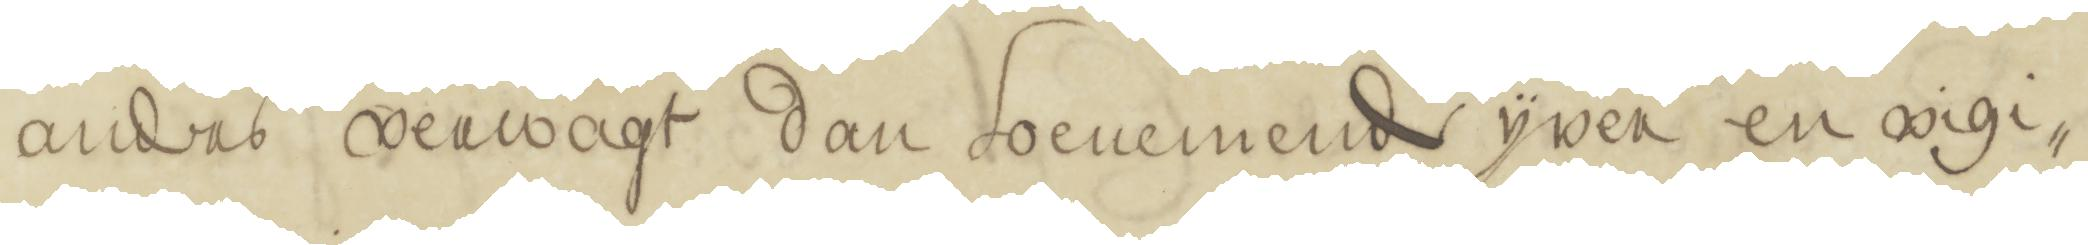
anders verwagt dan toenemende ijver en vigi„
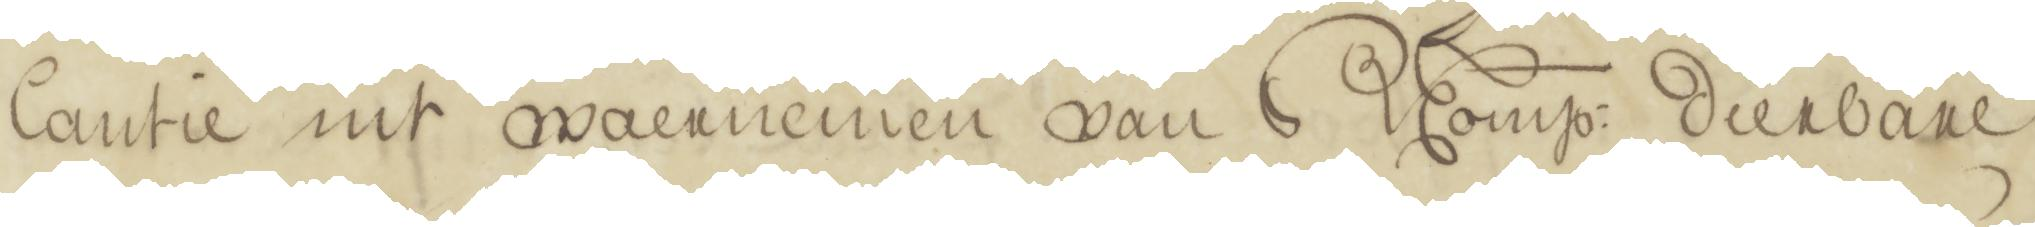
lantie int waernemen van s EComp: dierbare
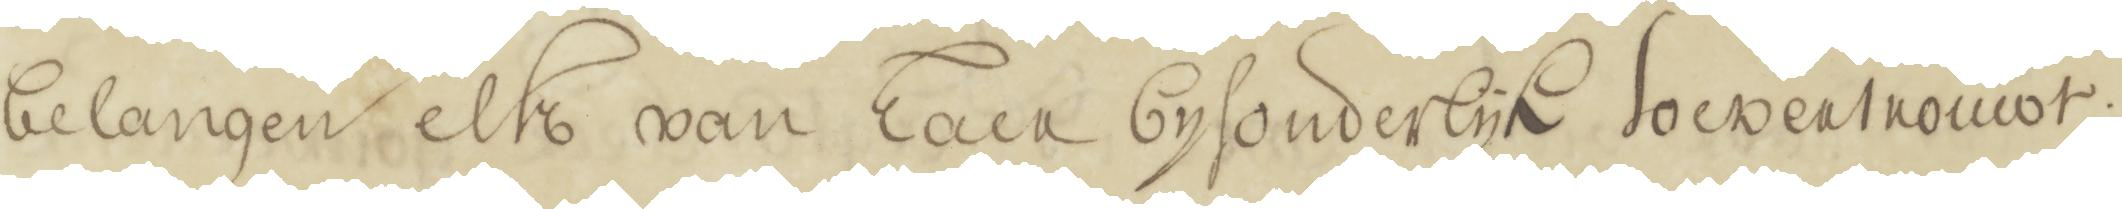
belangen elk van haer bysonderlijk toevertrouwt;
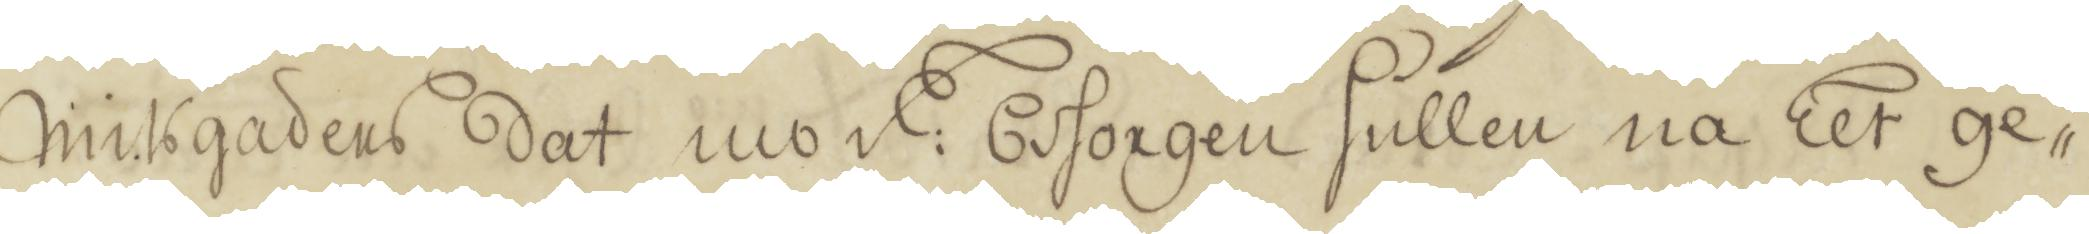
misgaders dat uw E: besorgen Sullen na het ge„
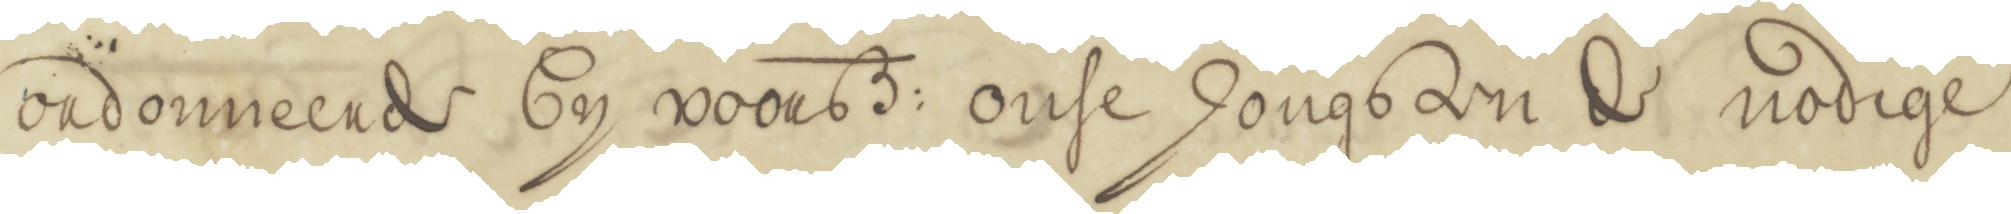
ordonneerde by voorsz: onse Jongsten de nodige
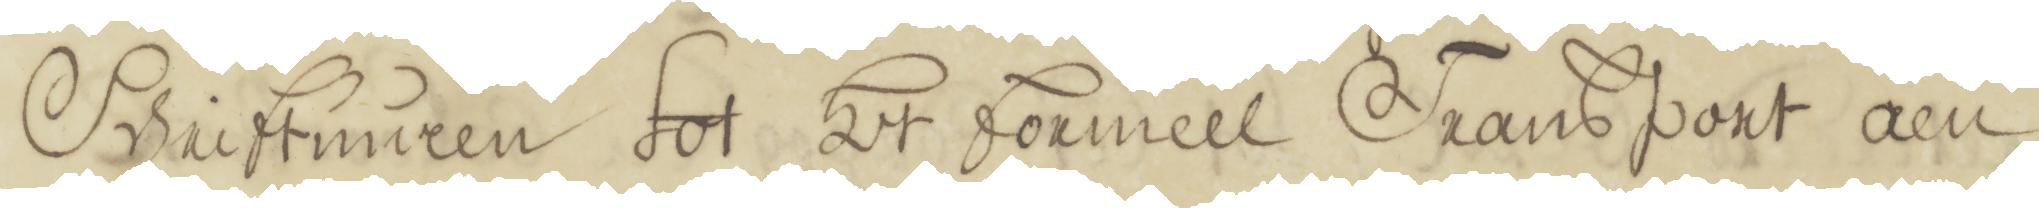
Schriftuuren tot het formeel Transport aen
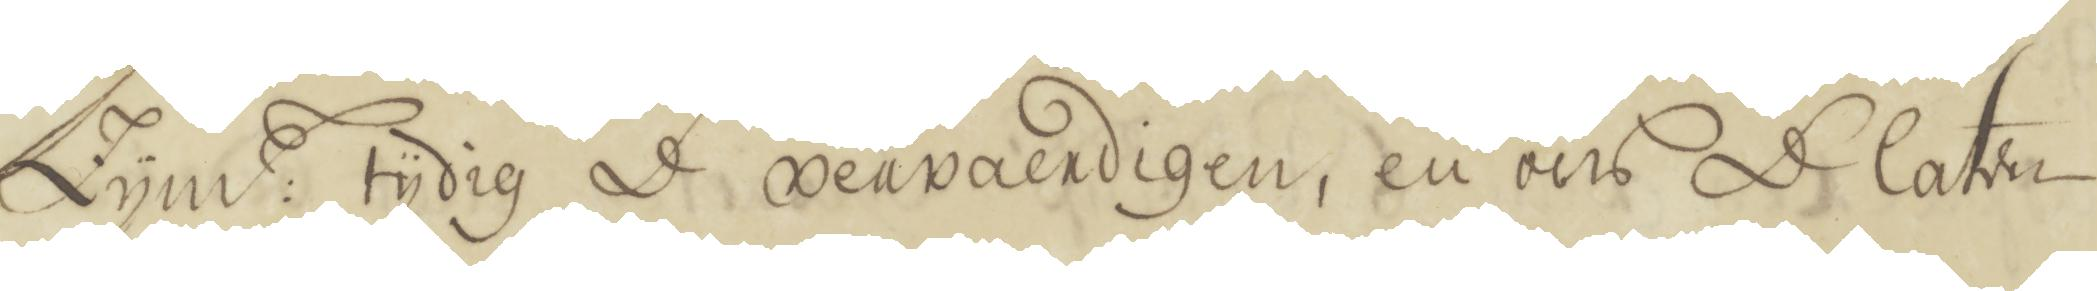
Zijn E: tijdig te vervaerdigen, en ons te laten
